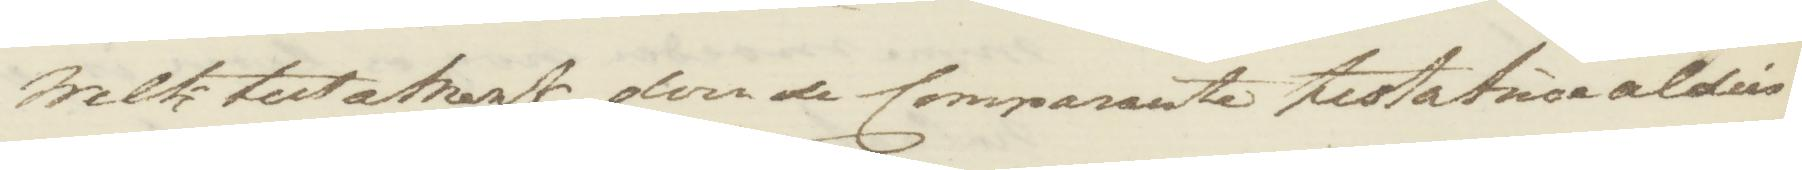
Welk testament door de Comparante testatrice aldus
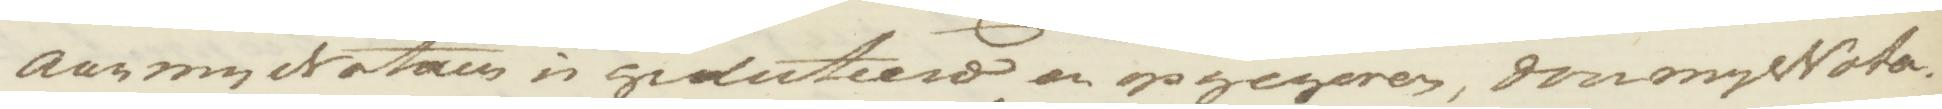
aan my Notaris is gedicteerd en opgegeven, door my Nota„
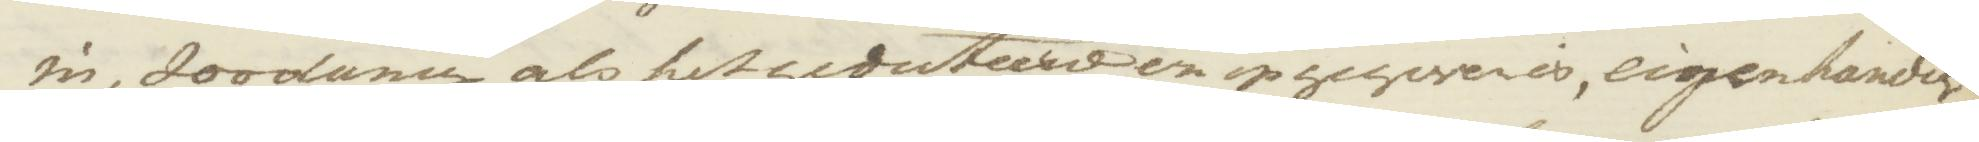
ris, zoodanig als het gedicteerd en opgegeven is, eigenhandig
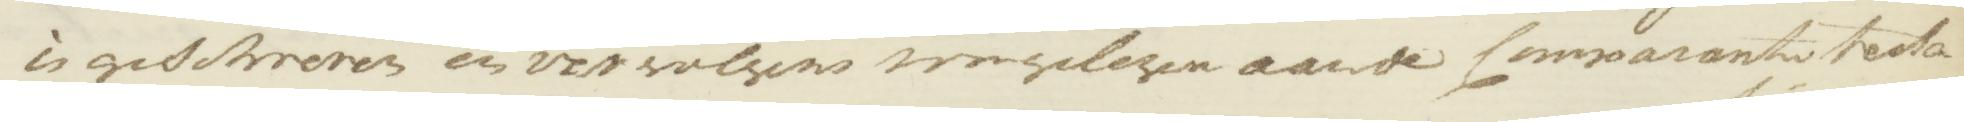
is geschreven en vervolgens voorgelezen aan de Comparante testa
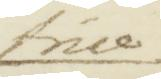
trice
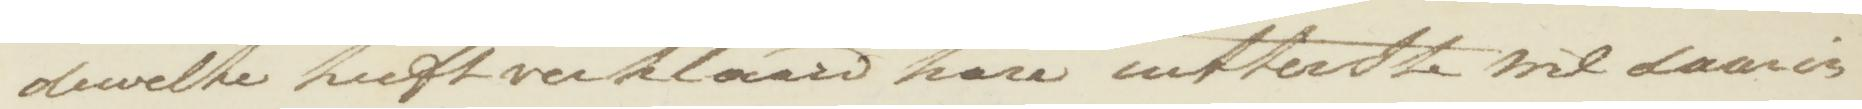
dewelke heeft verklaard hare uitterste wil daarin
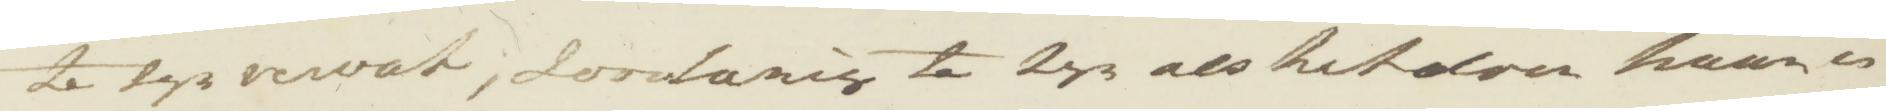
te zyn vervat, zoodanig te zyn als het door haar is
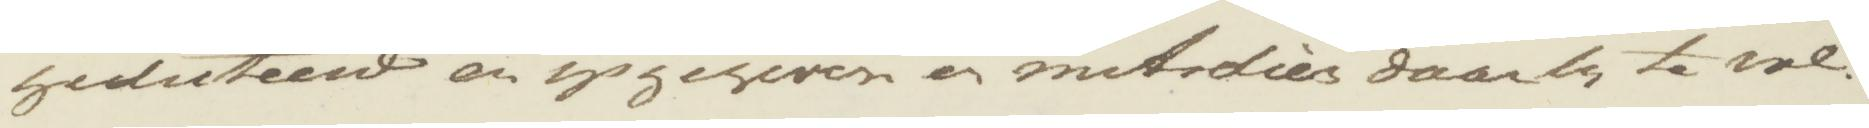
gedicteerd en opgegeven en mitsdien daarby te vol„
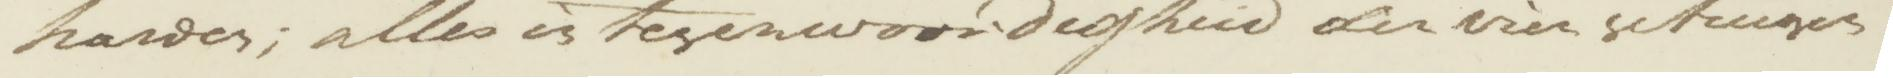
harden; alles in tegenwoordigheid der vier getuigen
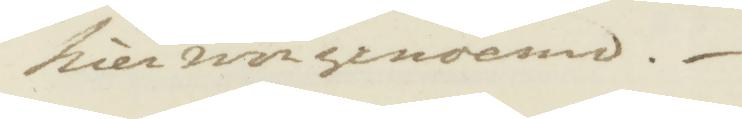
hier voor genoemd. —
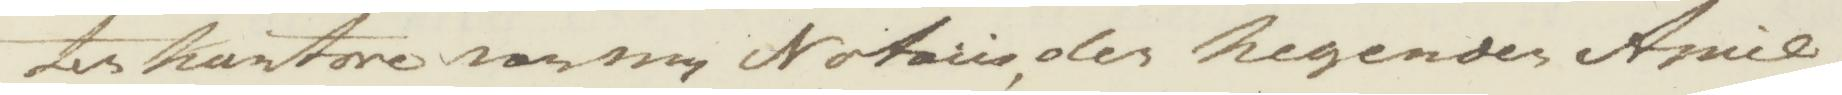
ten kantore van my Notaris, den Negenden April
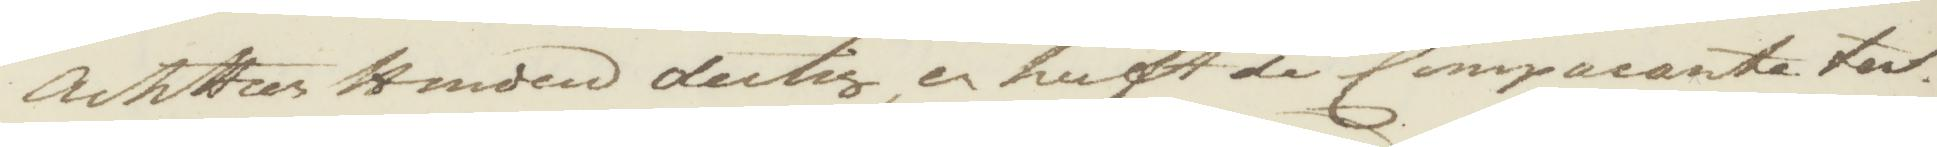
Achttien Honderd dertig, en heeft de Comparante tes„
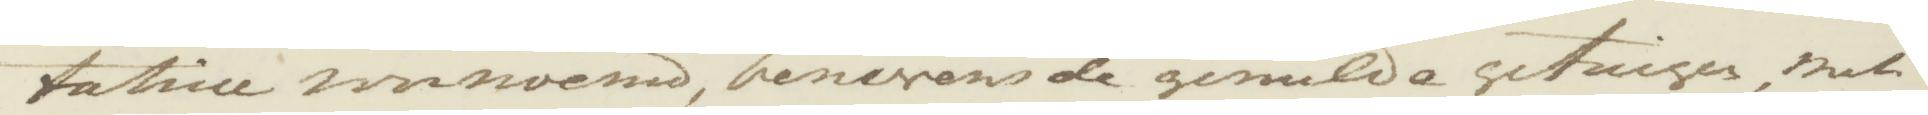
tatrice voornoemd, benevens de gemelde getuigen, met
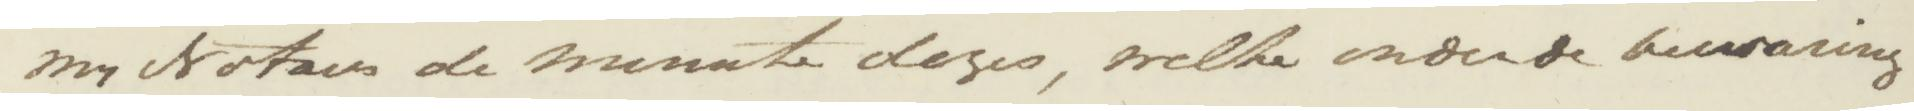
my Notaris de Minute dezes, welke onder de bewaring
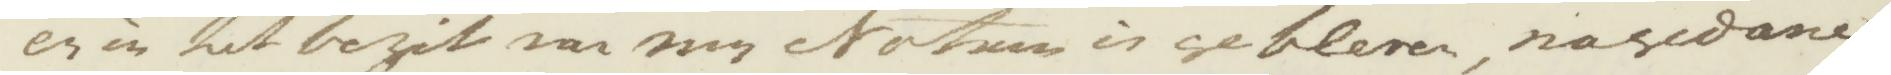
en in het bezit van my Notaris is gebleven, na gedane
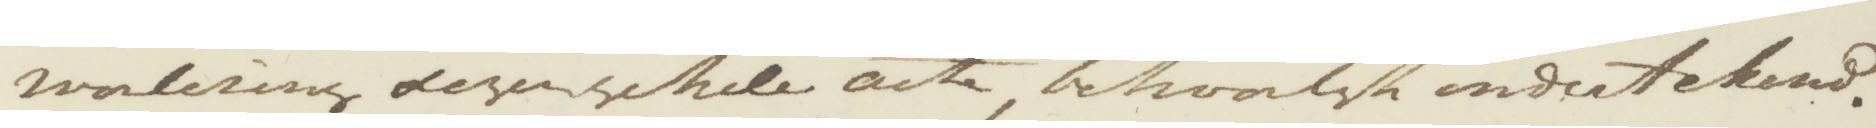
voorlezing dezen gehele acte, behoorlyk ondertekend.
